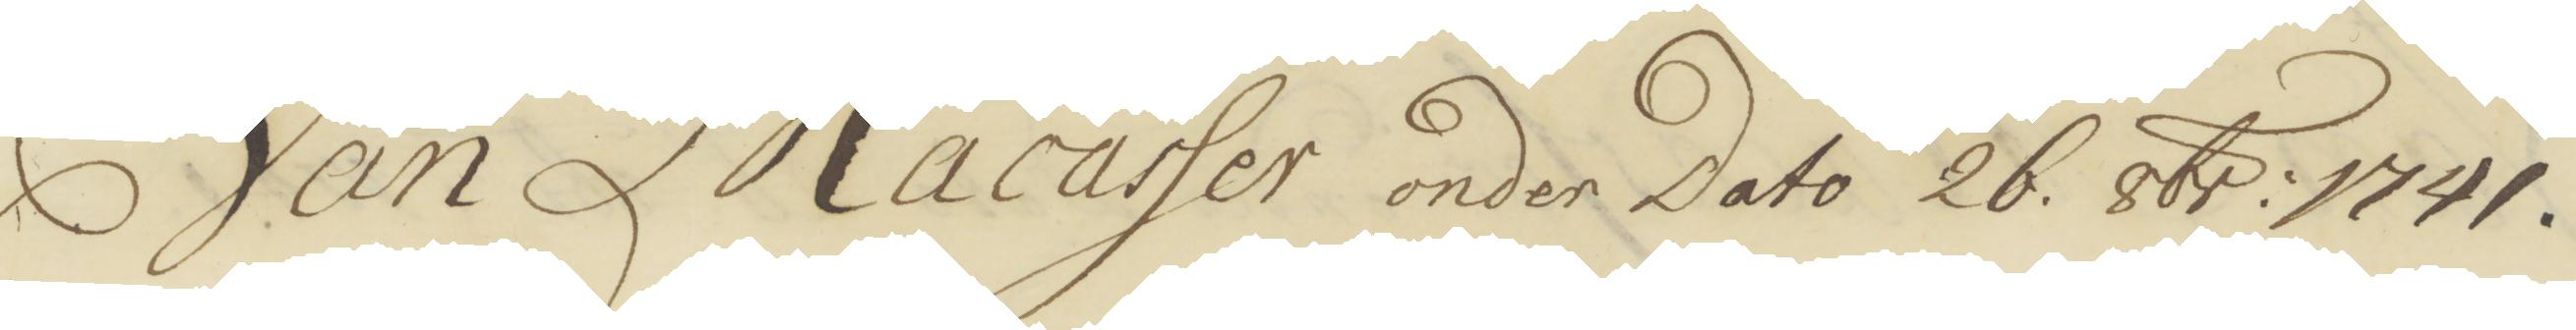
Van Macasser onder Dato 26. 8br: 1741.
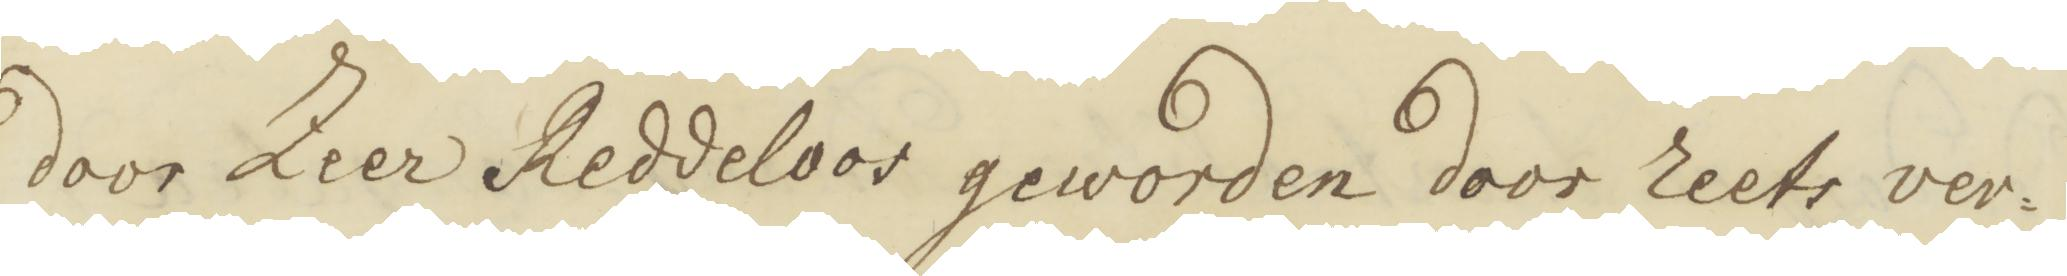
door Zeer Reddeloos geworden door reets ver„
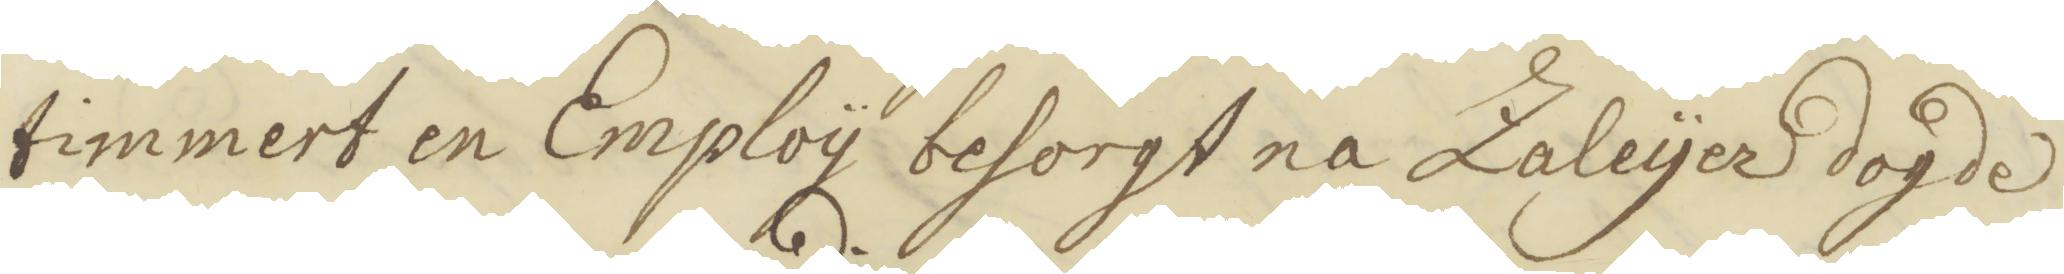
timmert en Emploij besorgt na Zaleijer dog de
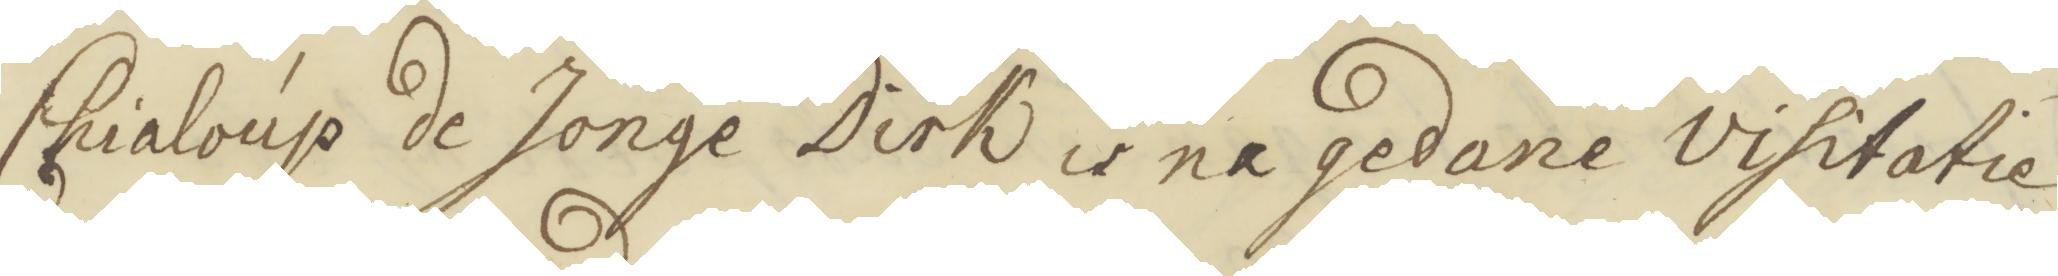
Chialoup de Jonge Dirk is na gedane visitatie
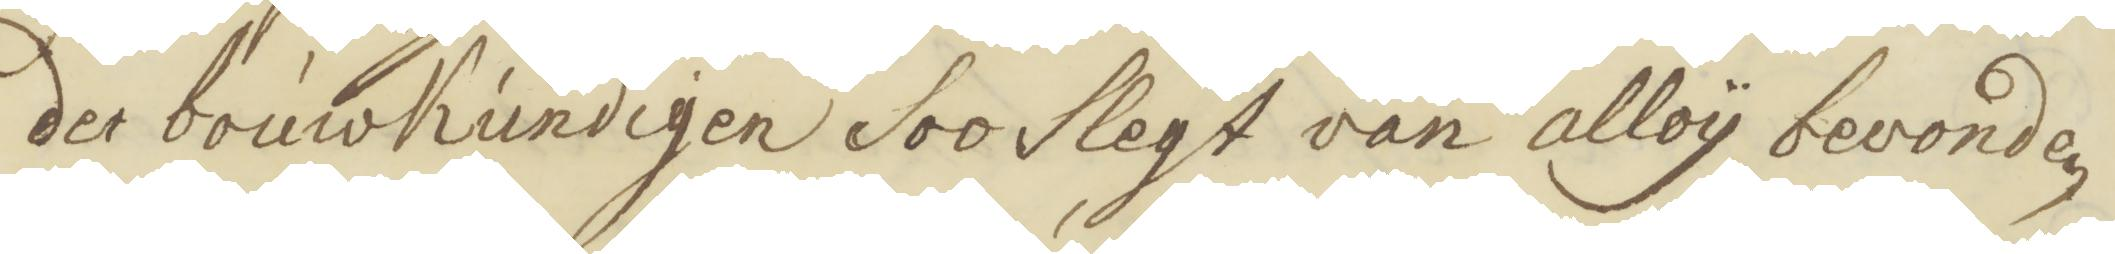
der bouwkundigen soo slegt van alloij bevonden
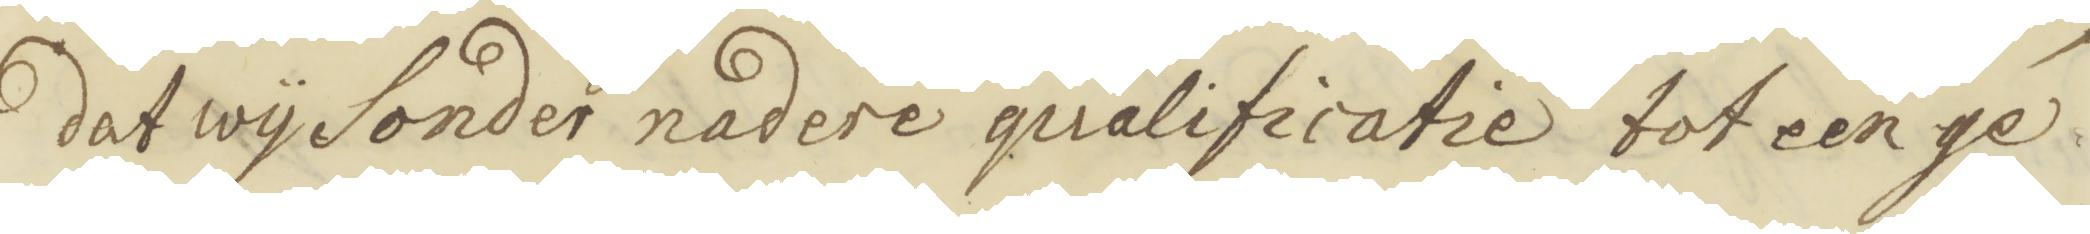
dat wij sondere nadere qualificatie tot een ge„
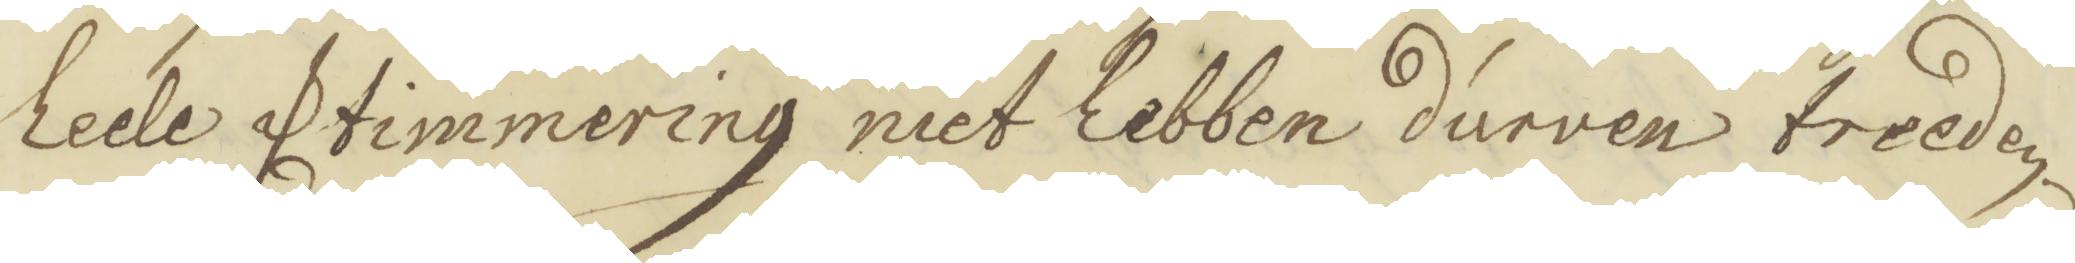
heele vertimmering niet hebben durven treeden
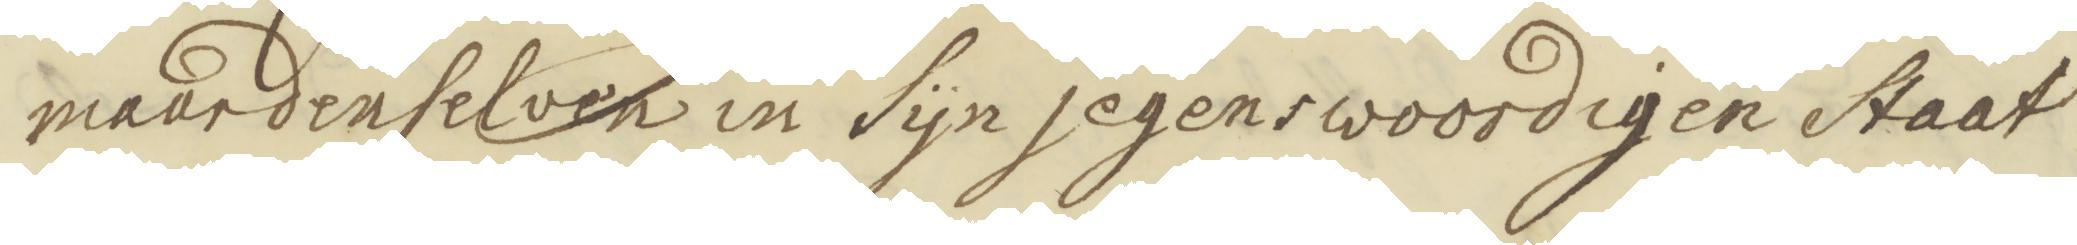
maar denselven in sijn jegenswoordigen staat
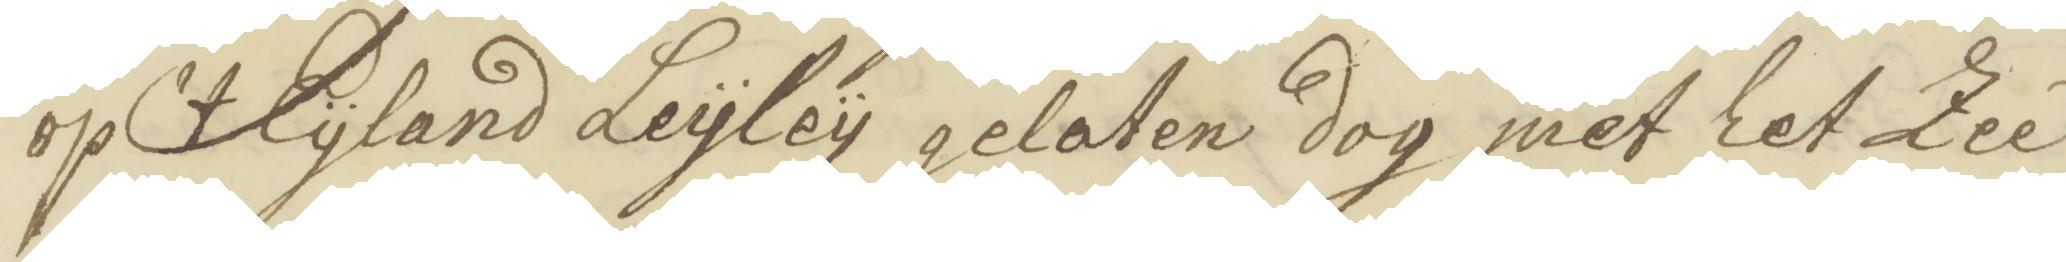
op ’t Eijland Leijleij gelaten dog met het Zee
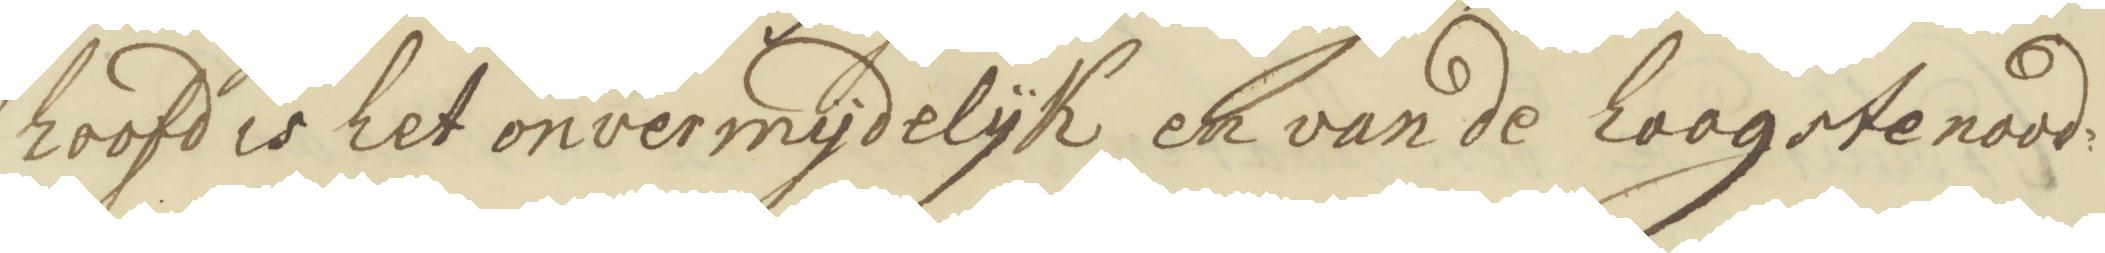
hoofd is het onvermijdelijk en van de hoogstenood:
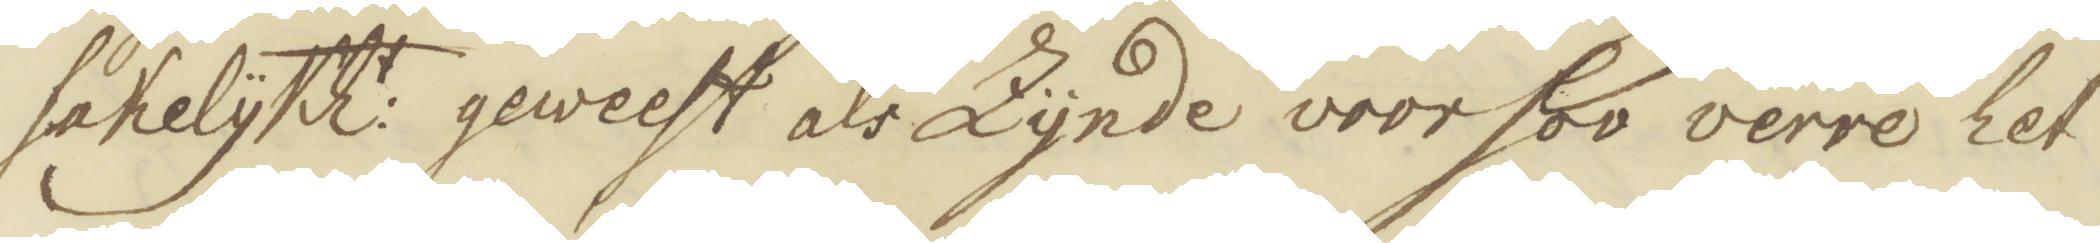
sakelijkh:t geweest als Zijnde voor soo verre het
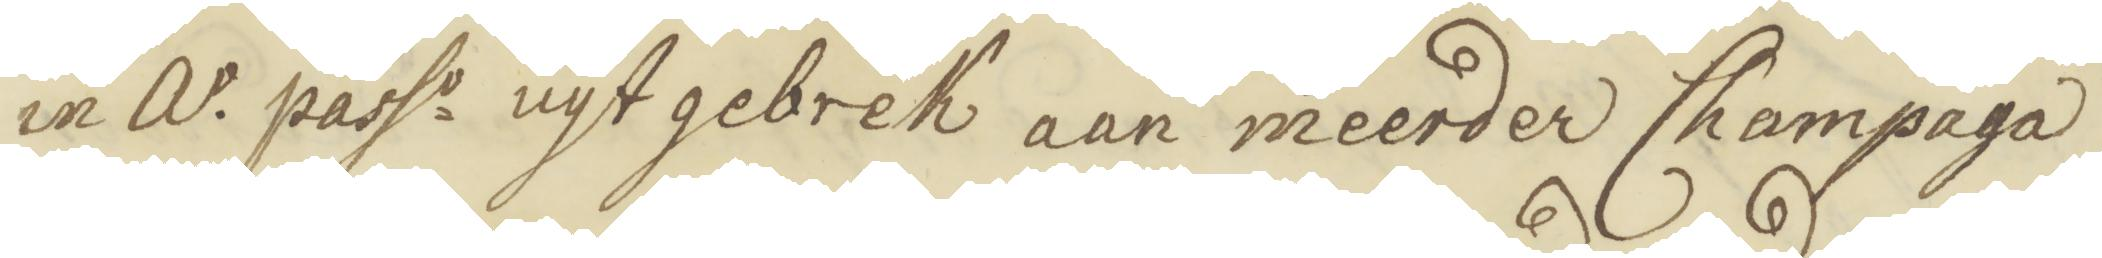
in A.o pass=o uijt gebrek aan meerder Champaga
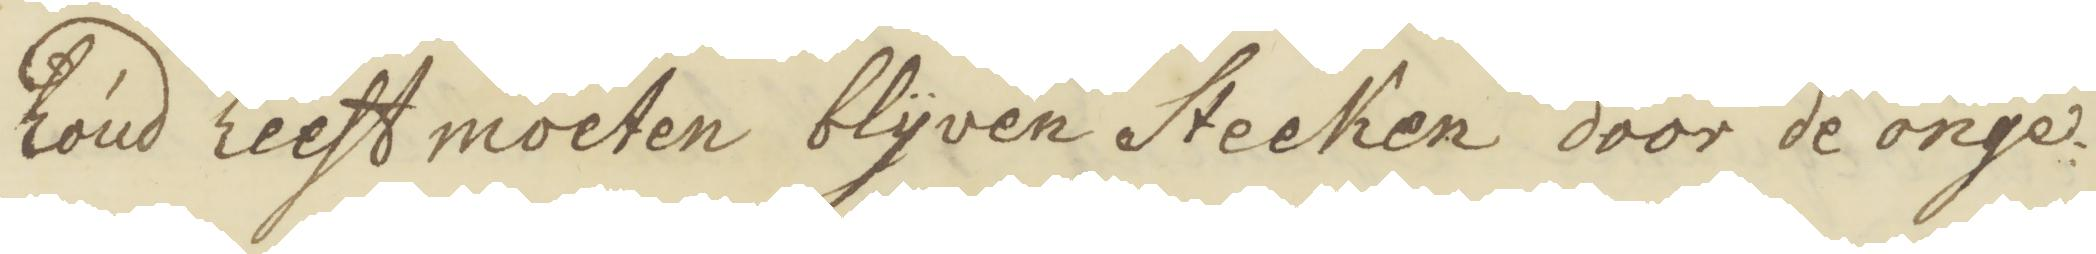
houd heeft moeten blijven steeken door de onge„
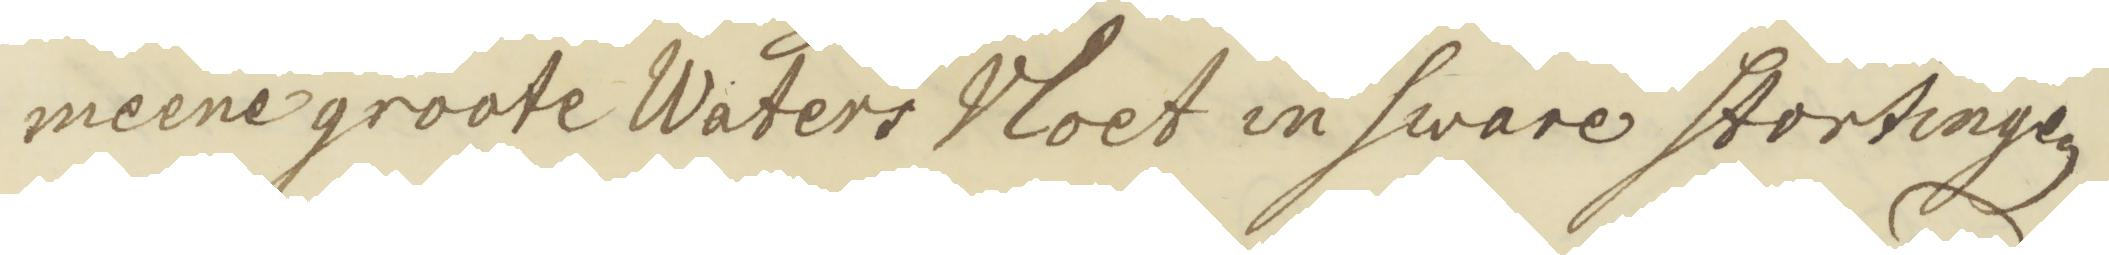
meene groote Waters Vloet in sware stortingen
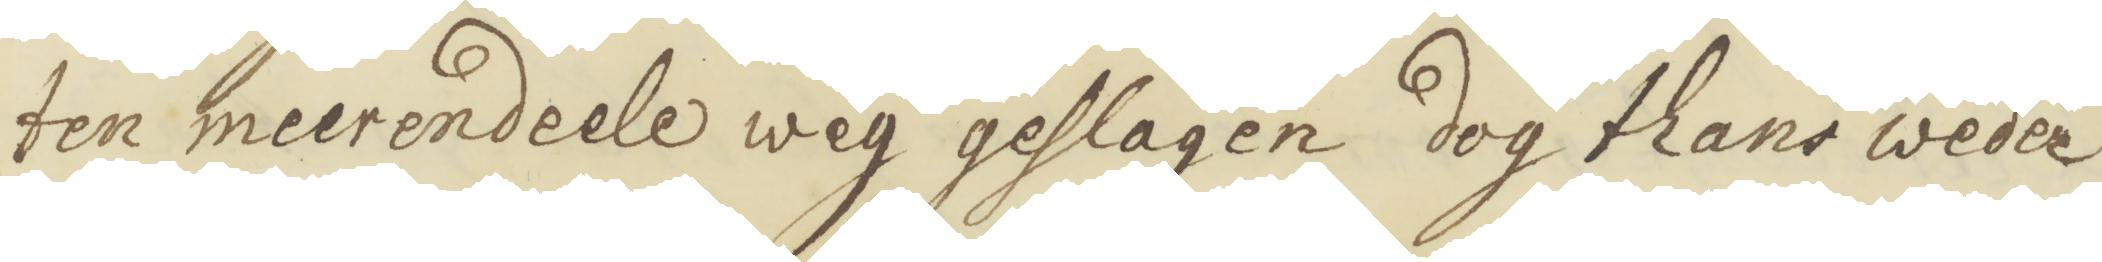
ten meerendeele weg geslagen dog thans weder
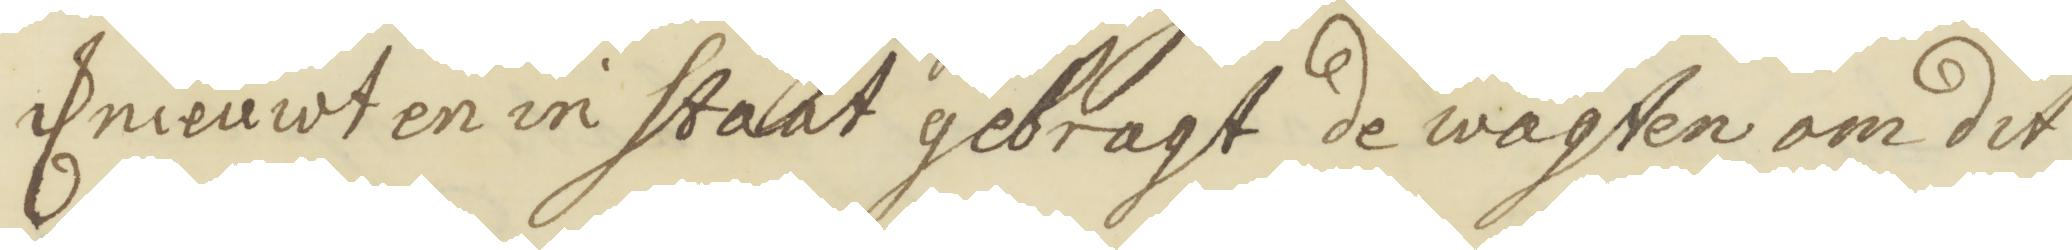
vernieuwt en in staat gebragt de wagten om dit
